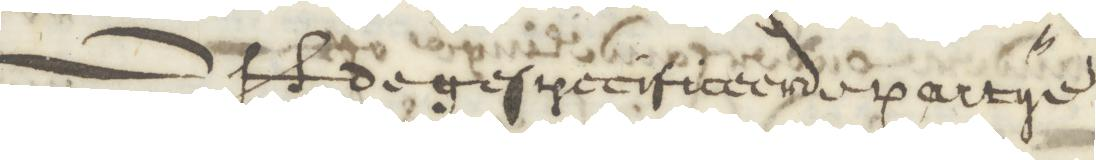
Off de gespecificeerde partije
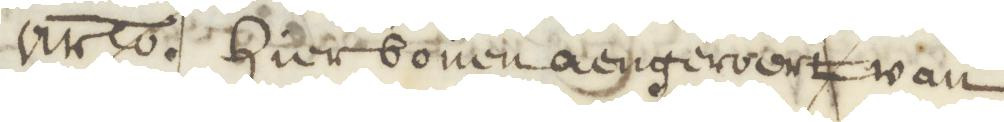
arlo. hier boven aengereert van
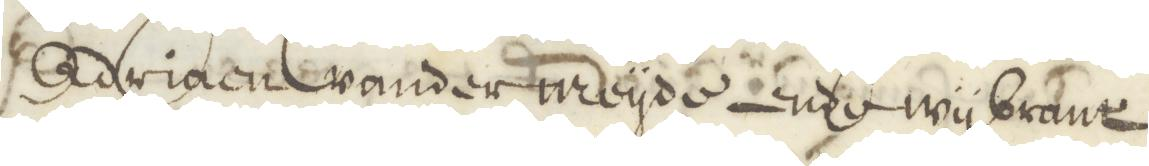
Adriaen vander meijde ende wijbrant
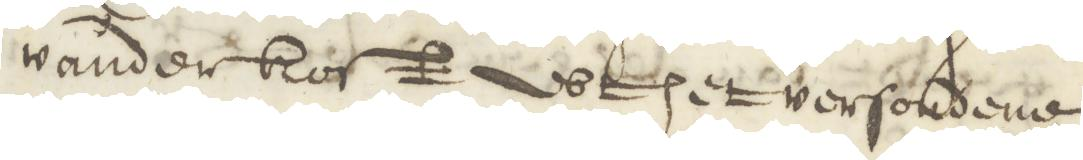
vander kost wt het versondene
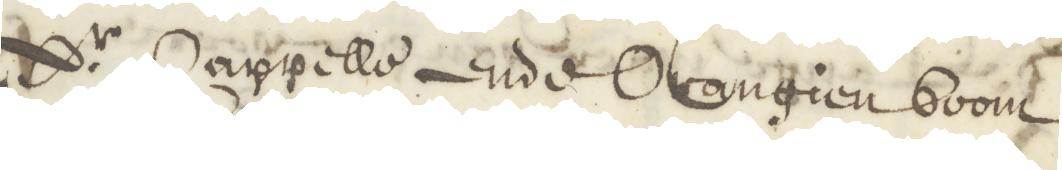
p„r Cappelle ende Orangienboom
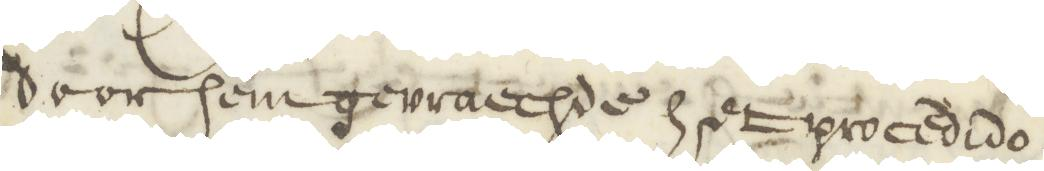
door hem gevraechde het procedido
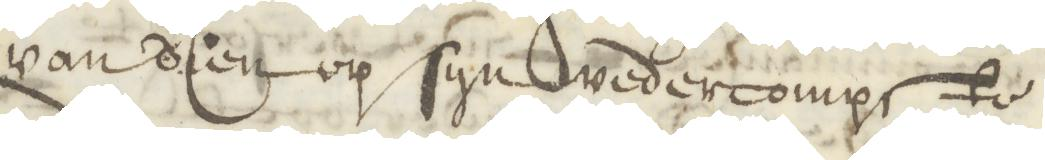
van dien op sijn wedercompste
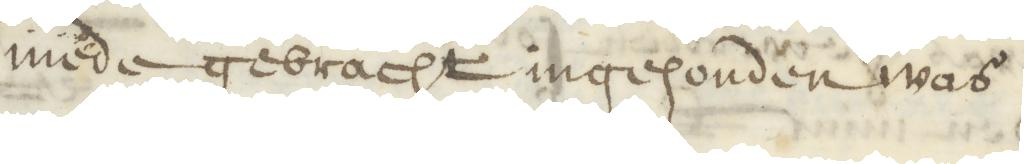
mede gebracht ingehouden was
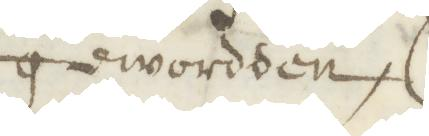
gewordden,
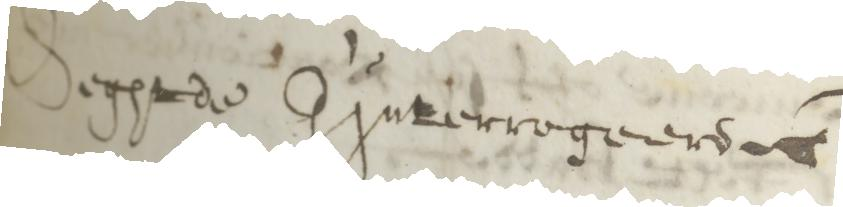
Seght de G'jnterregeerd —
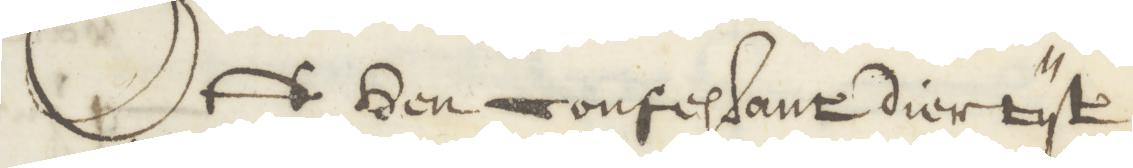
Off hen confessant dier tijt
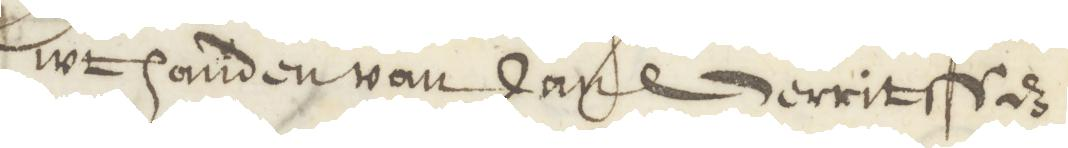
wt handen van Jan Gerritssen
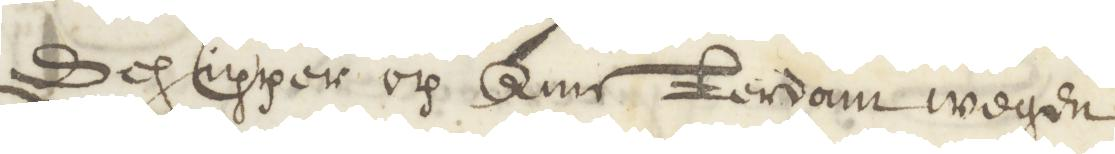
schipper op amsterdam wegen
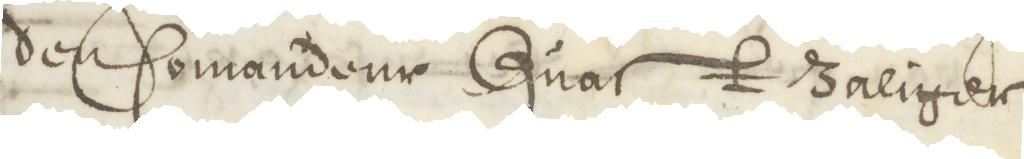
den Comandeur Quast zaliger
